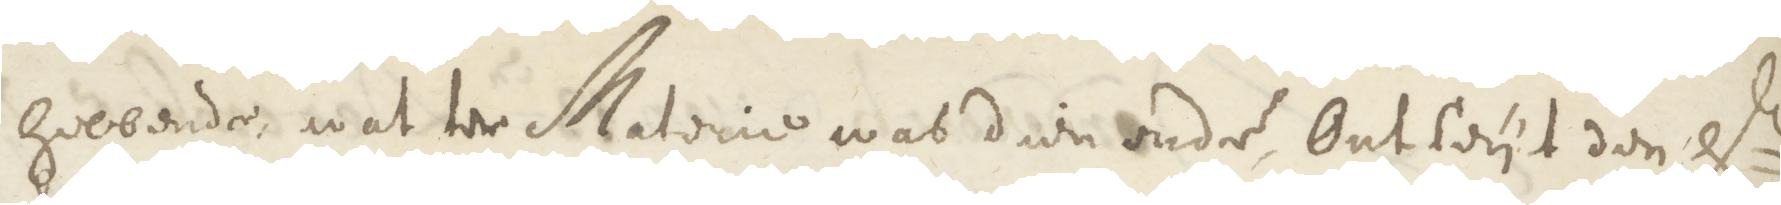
hebbende, wat ter Materie was dienende, Ontseijt den h=r
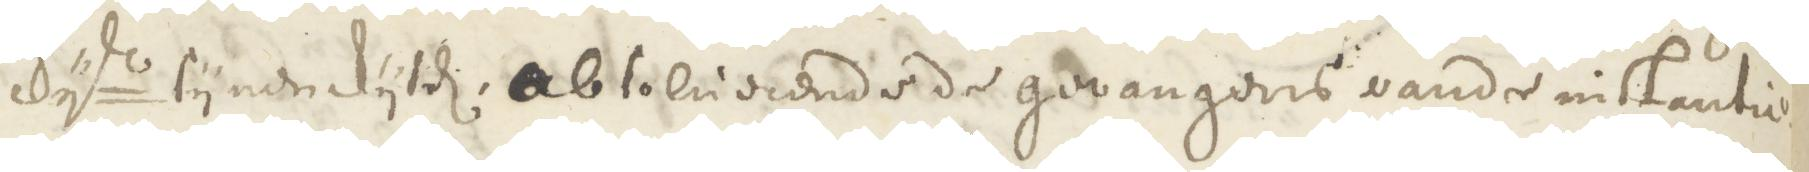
Eij=r sijnen Eijsch; absolverende de gevangens vande instantie
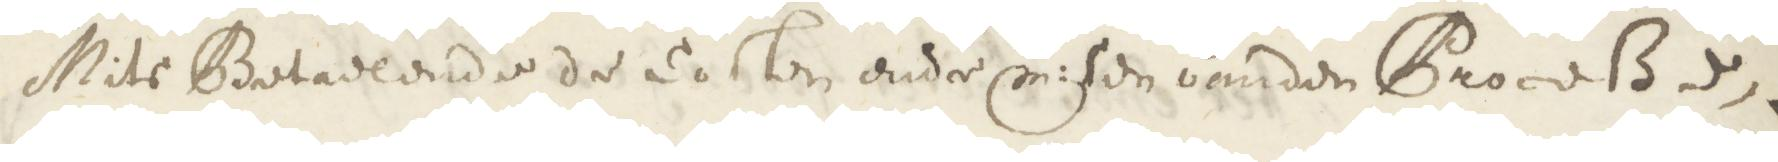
Mits Betaelende de Costen ende m: sen van den Proceꞵe,
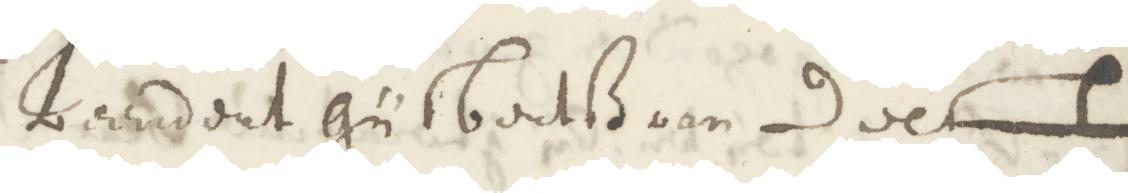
Leendert gijsbertꞵ van Delft
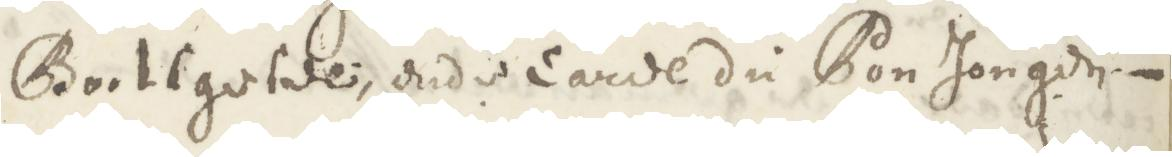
Bootsgesel, ende Carel du Pon Jongen —
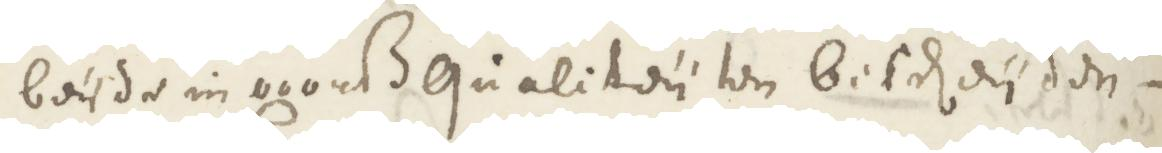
beijde in voorꞵ qualiteijten bescheijden
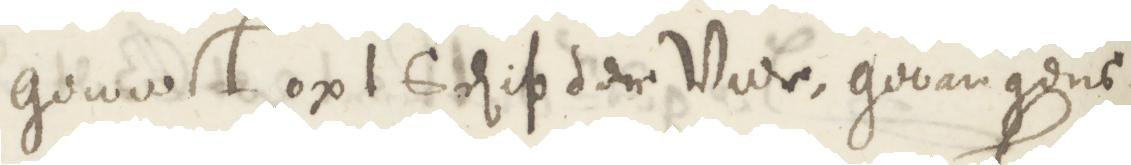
geweest op t Schip der Veer, gevangens
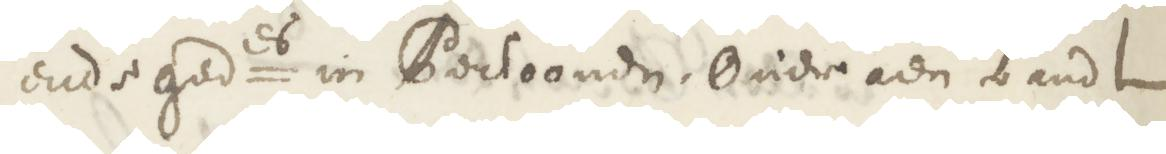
ende ged=es in Persoonen, Over aen Landt
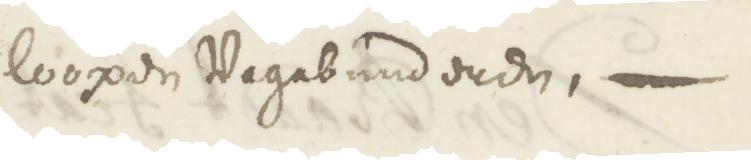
loopen Vagabunderen, —
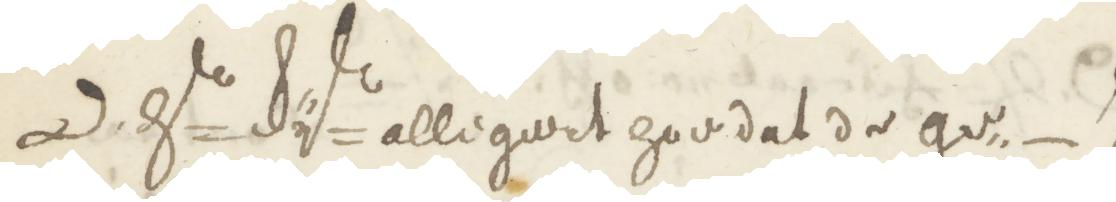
D. h=r Eij=r allegeert hoe dat de ge„ —
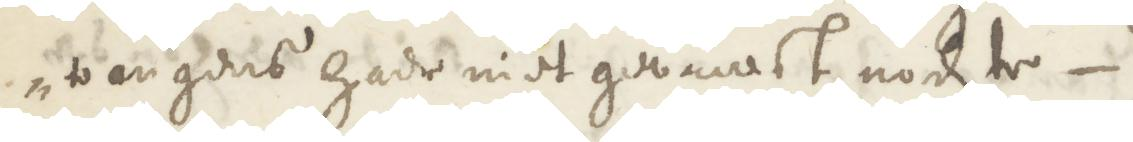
„vangens haer niet gevreest noch te —
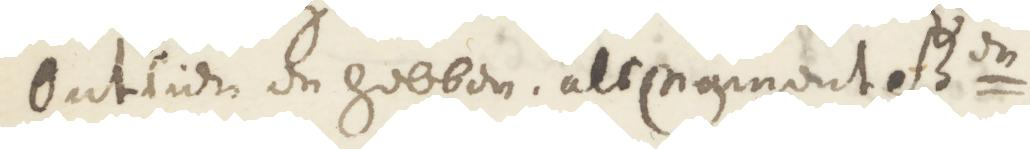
Ontsien en hebben, als namentlijk=en
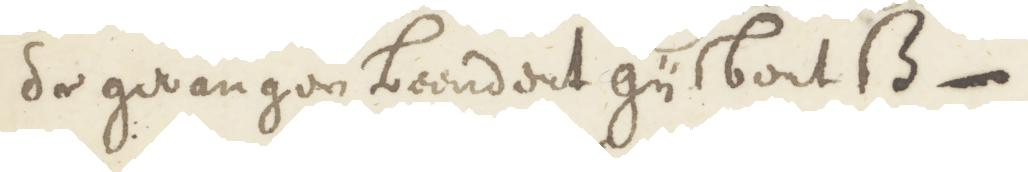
de gevangen Leendert gijsbertꞵ —
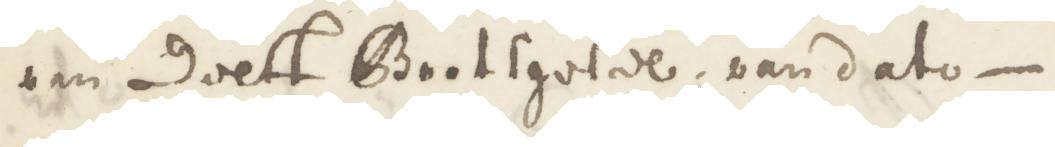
van Delft Bootsgesel van dato —
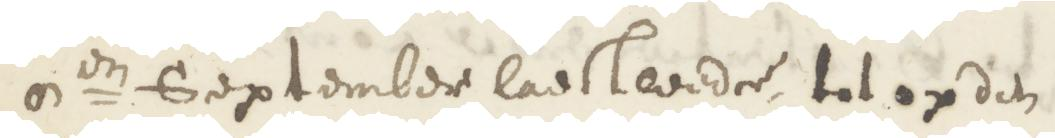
8=en September laestleede, tot op den
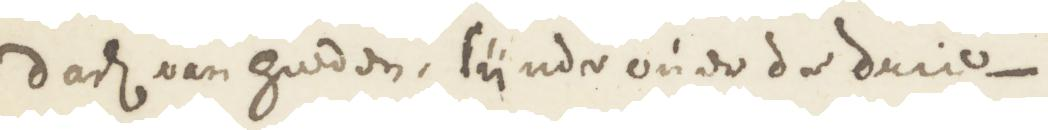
dach van heeden, Sijnde over de drie —
